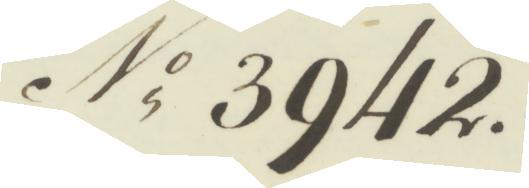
N„o 3942.
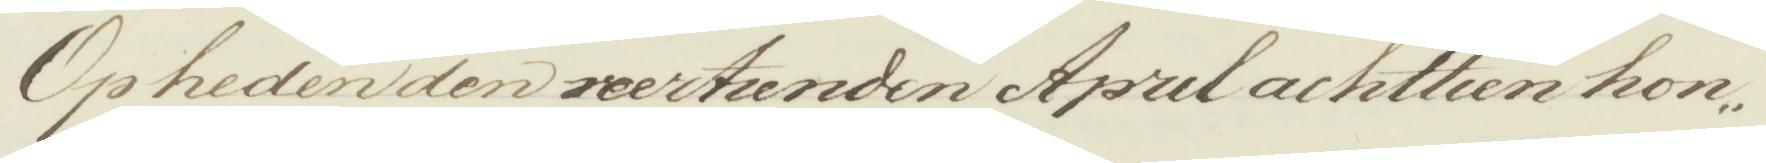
Op heden den veertienden April achttien hon„
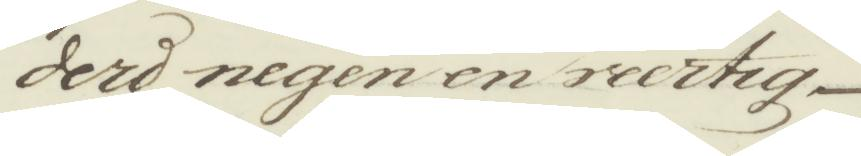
derd negen en veertig.-
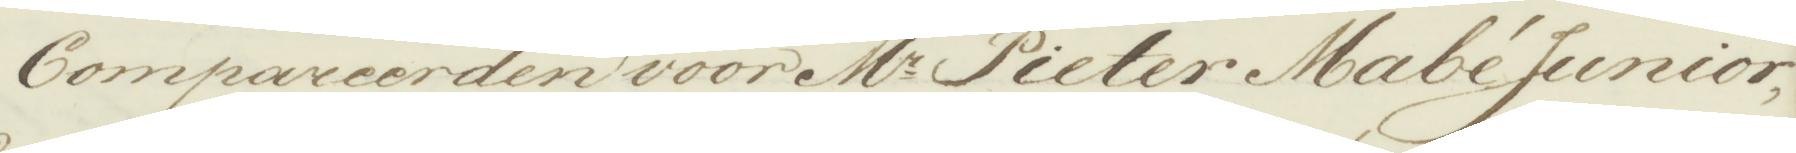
Compareerden voor M:r Pieter Mabé Junior,
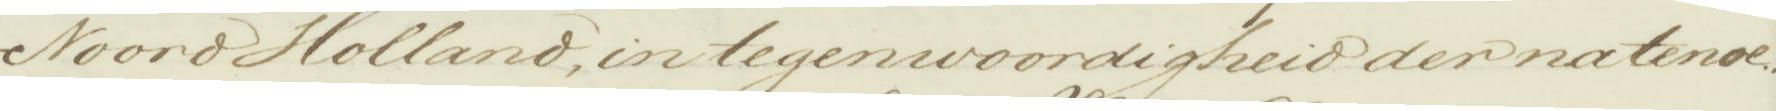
Noord Holland, in tegenwoordigheid der natenoe
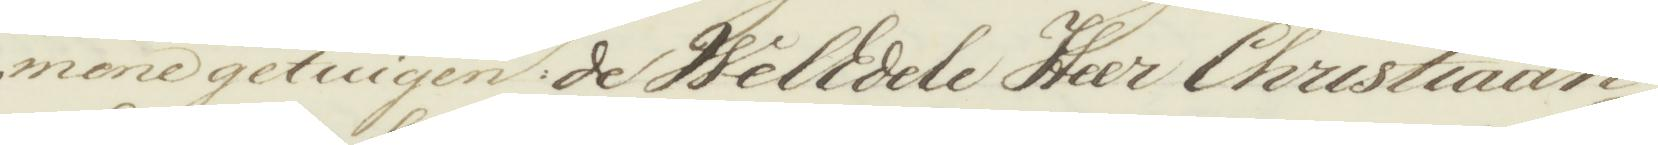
mene getuigen: de WelEdele Heer Christiaan
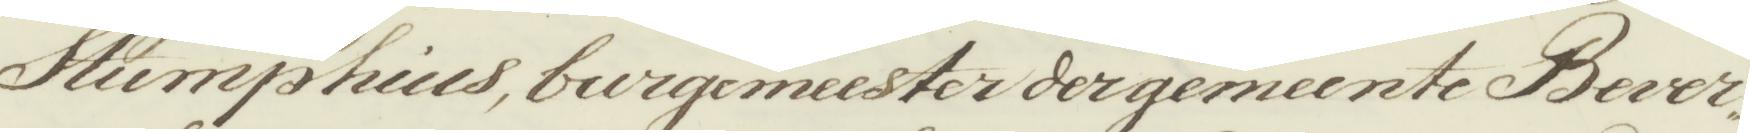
Stumphius, burgemeester der gemeente Bever„
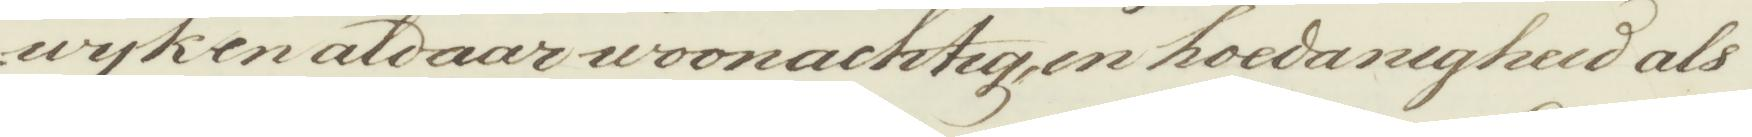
wijk en aldaar woonachtig, in hoedanigheid als
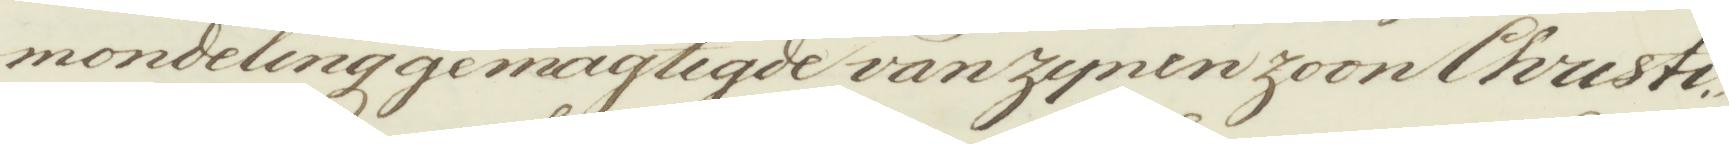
mondeling gemagtigde van zynen zoon Christi„
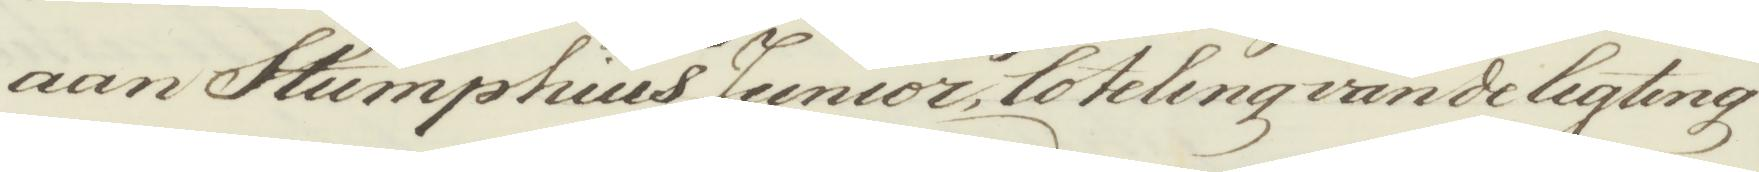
aan Stumphius Junior, loteling van de ligting
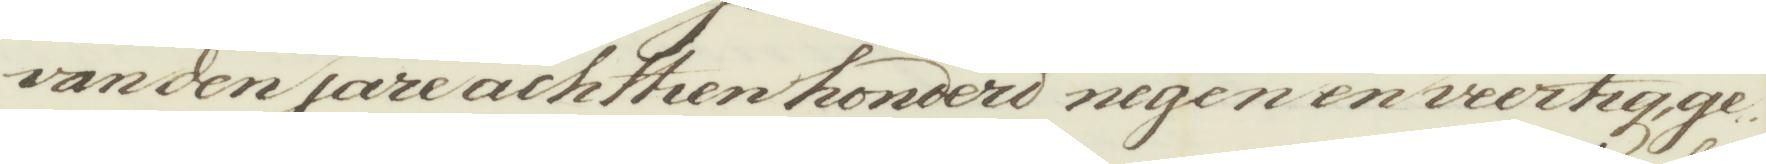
van den jare achttien honderd negen en veertig, ge„
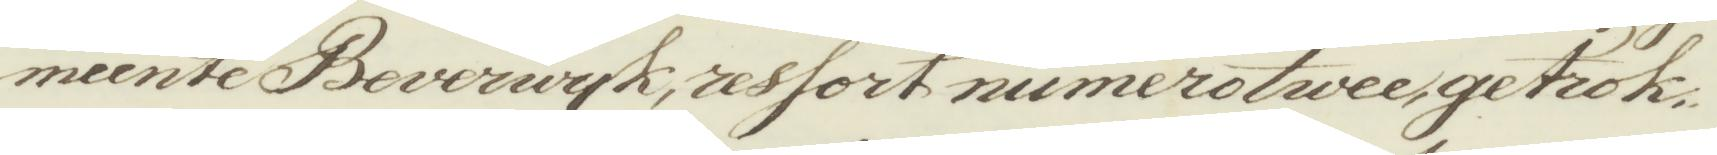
meente Beverwijk, ressort numero twee, getrok„
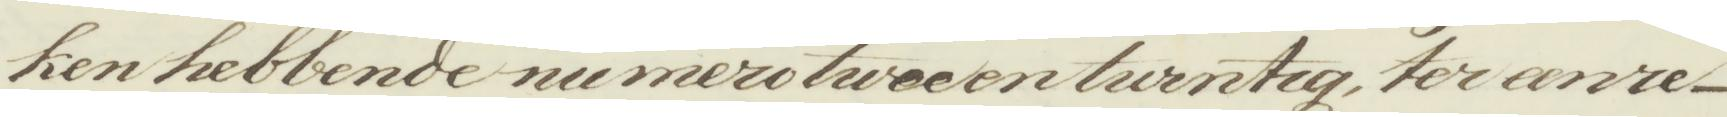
ken hebbende numero twee en twintig, ter eenre-
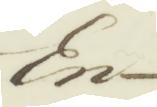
En-
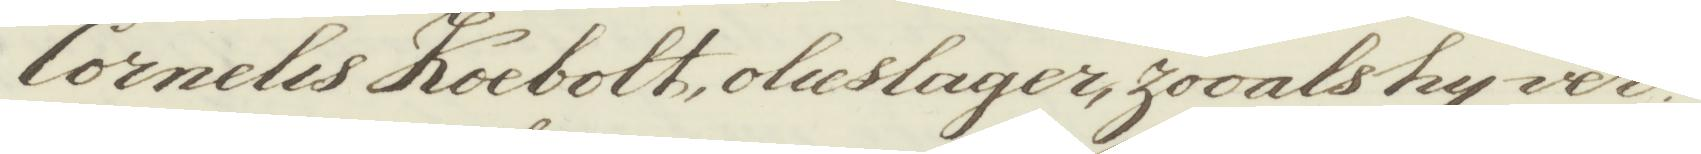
Cornelis Koebolt, olieslager, zoo als hij ver„
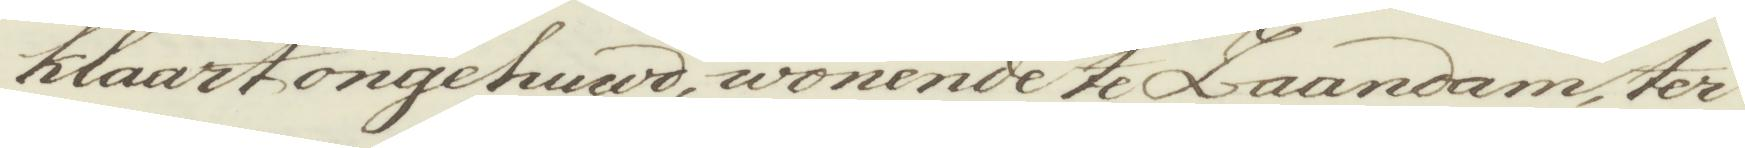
klaart ongehuwd, wonende te Zaandam, ter
